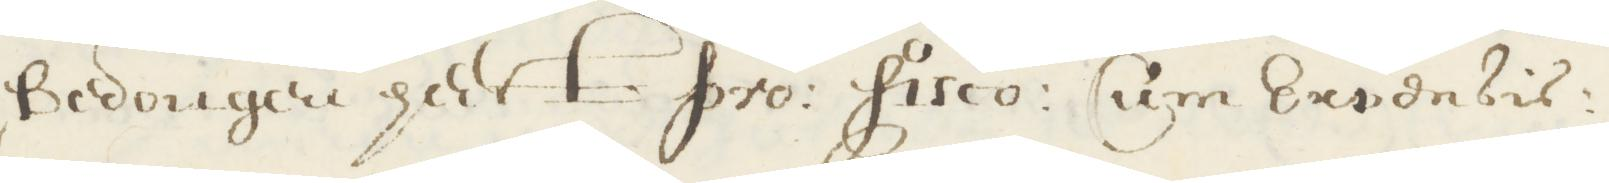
bedongen heeft Pro: Fisco: Cum Expensis:
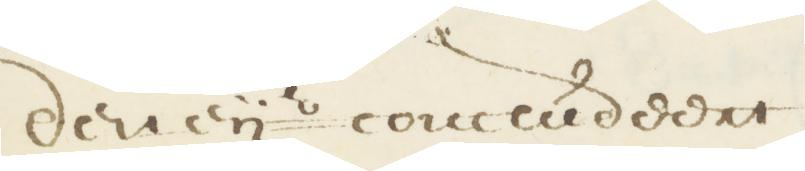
den eij=r concludeert
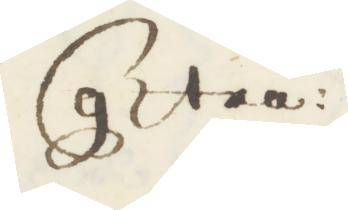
Contra:
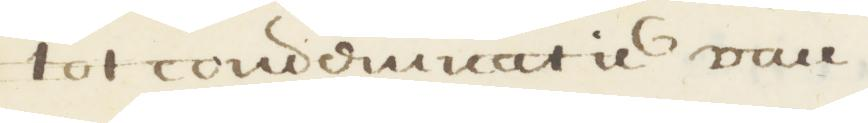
tot condemnatie van
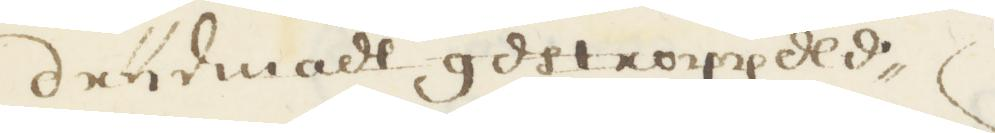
drijemael gestroppele„
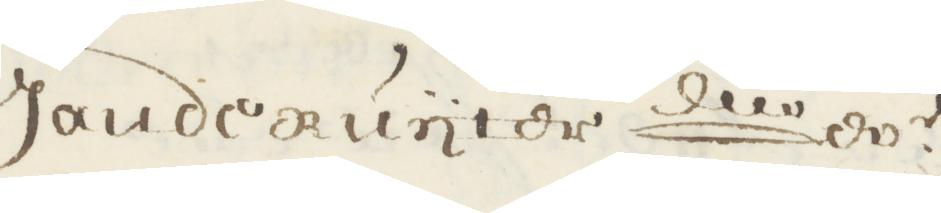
Janderuijter Gev:e
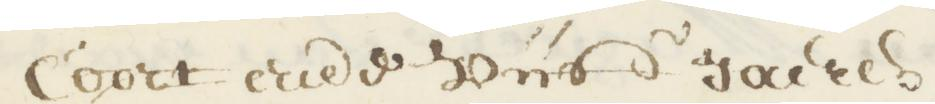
Coort ende Vijff Iaeren
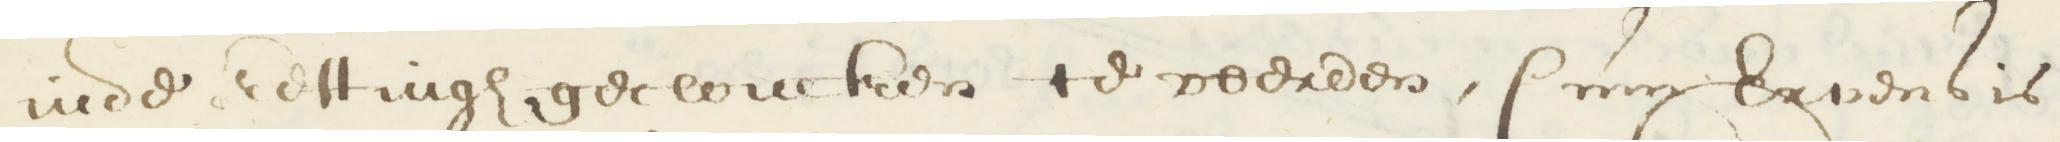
inde kettingh gecloncken te werden, Cum Expensis
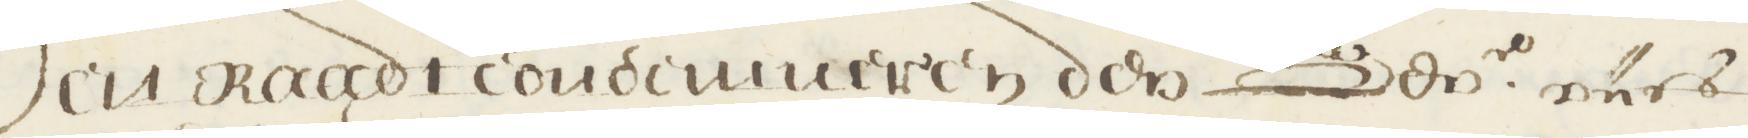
Den raadt condemneren den Gev.e vijff
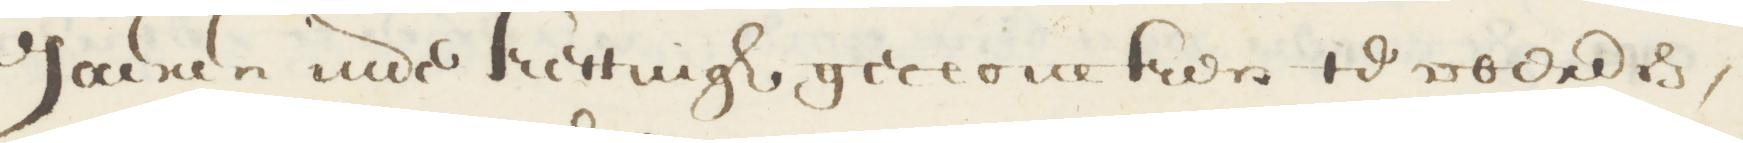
Jaeren inde kettingh gecloncken te werden,
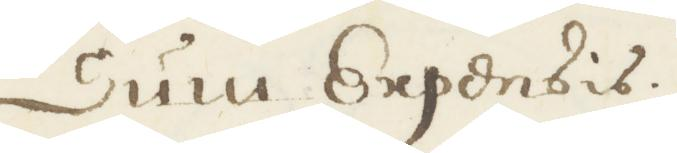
Sum Expensis.
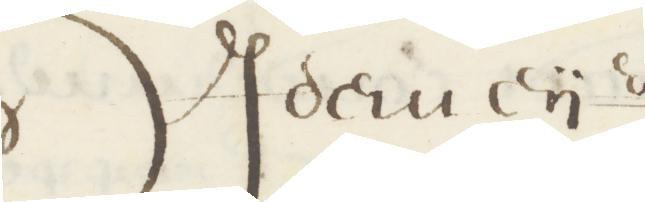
Jdem eij=r
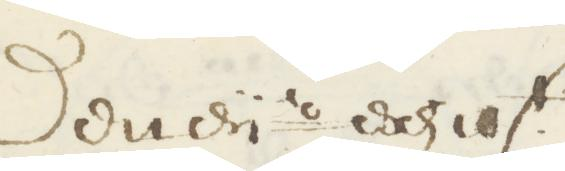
Den eij=r exhib.t
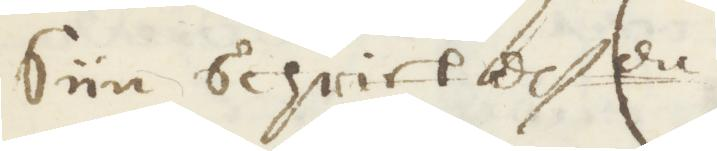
sijn schriftel=en
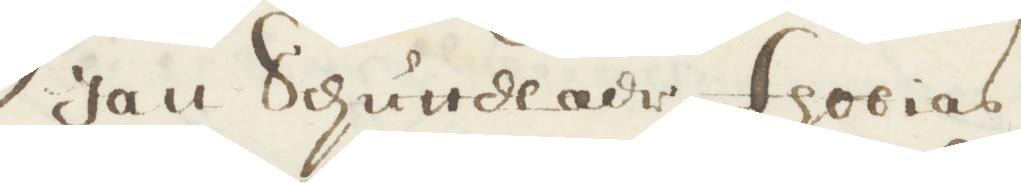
Ian Schuttelaer Thobias
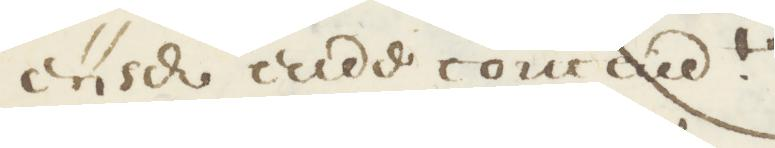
eijsch ende conclud.t
